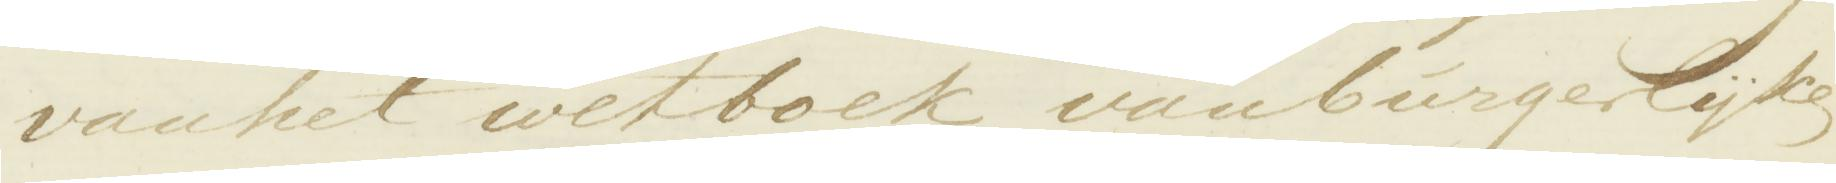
van het wetboek van burgelijken
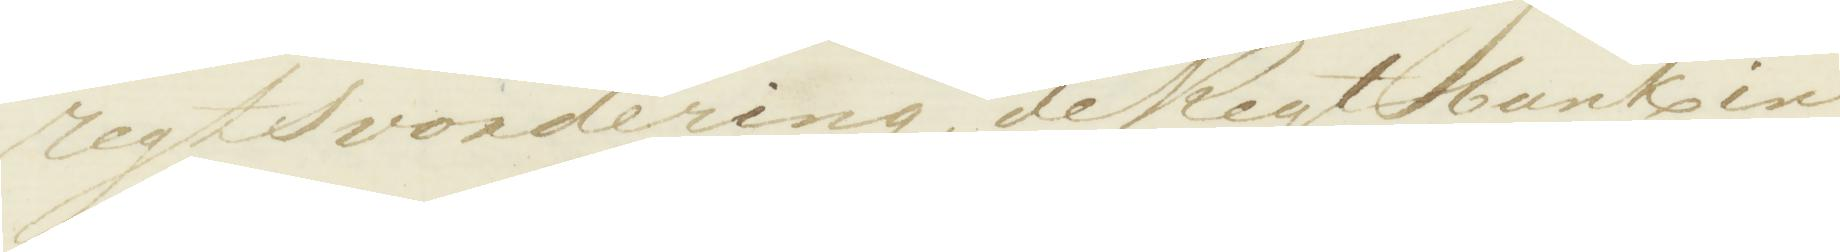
regtsvordering, de Regtbank in
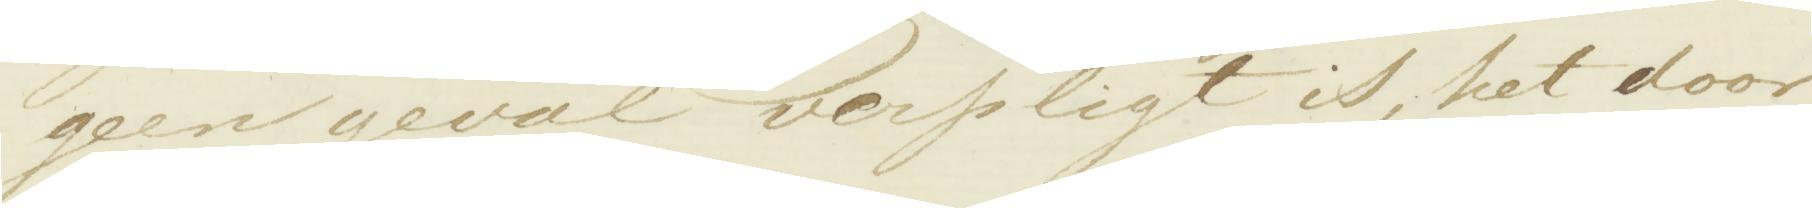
geen geval verpligt is, het door
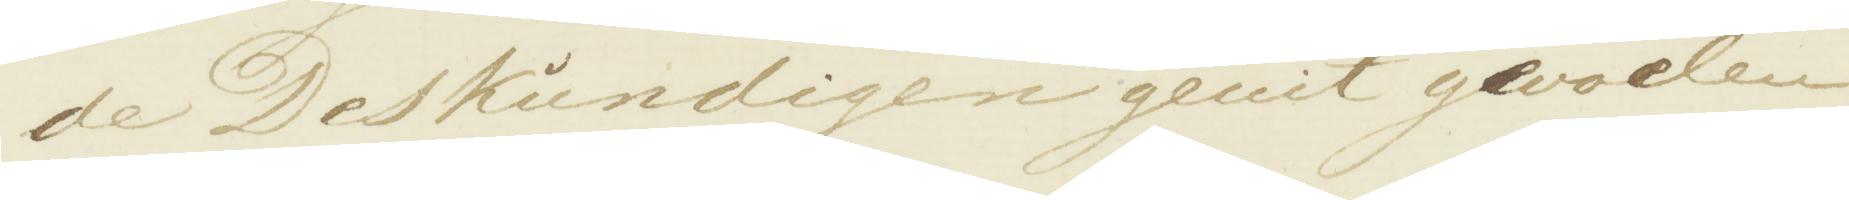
de Deskundigen geuit gevoelen
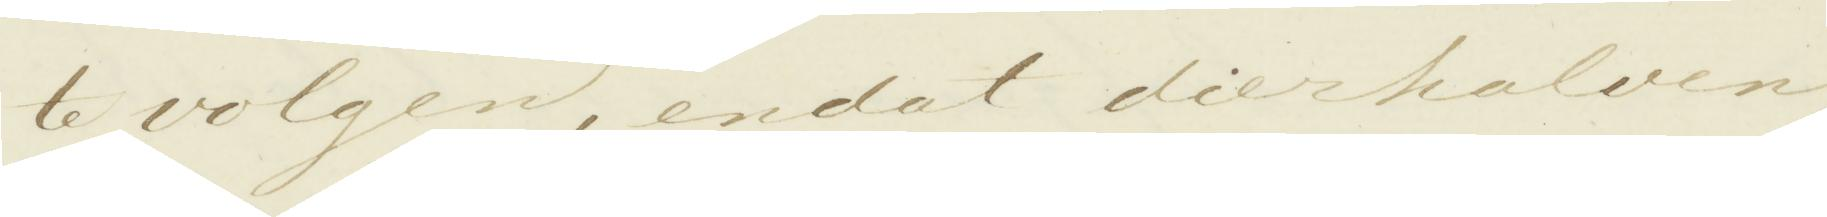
te volgen, en dat dierhalven,
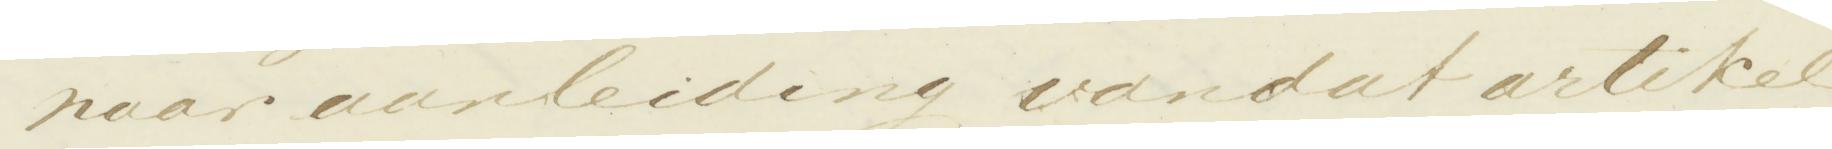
naar aanleiding van dat artikel,
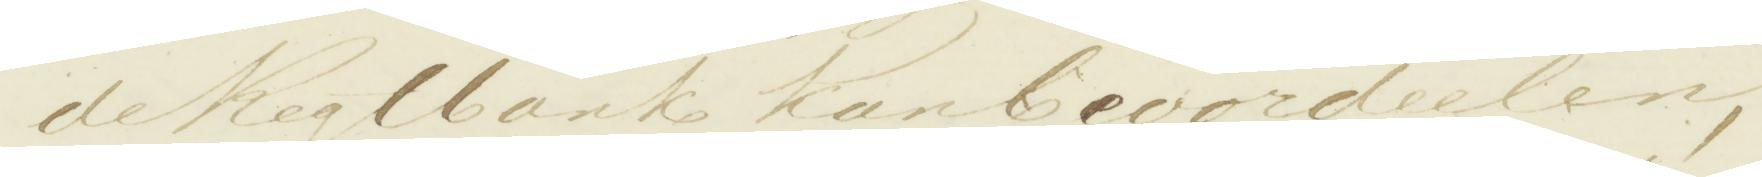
de Regtbank kan beoordeelen,
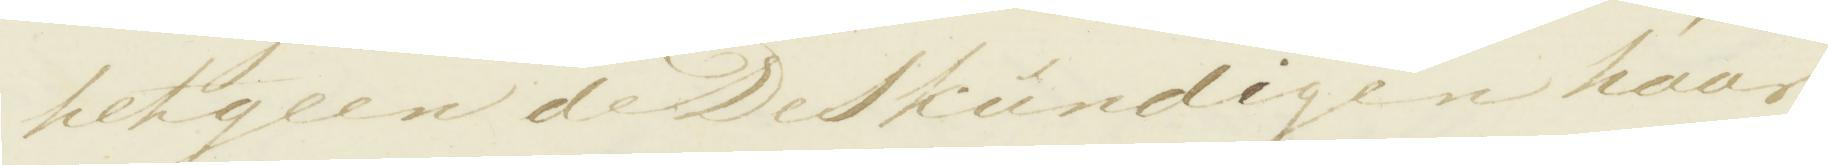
hetgeen de Deskundigen haar
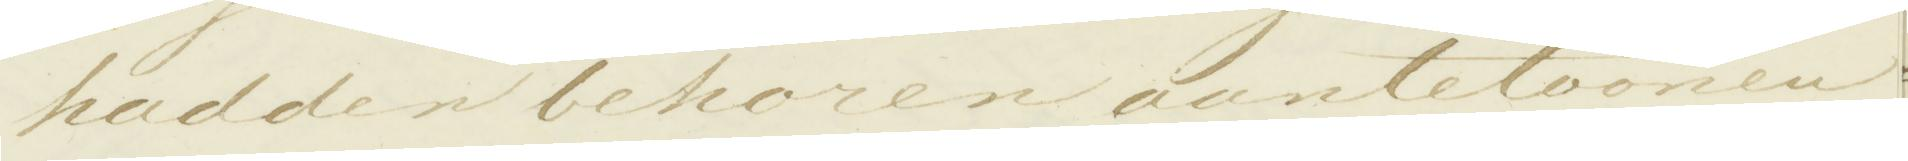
hadden behoren aantetoonen,
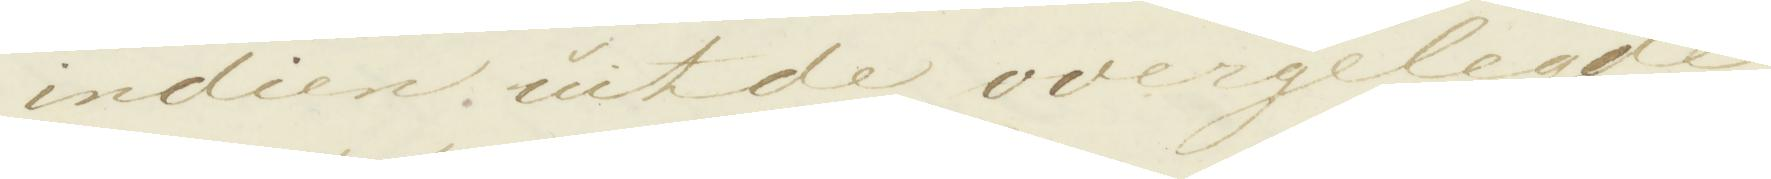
indien uit de overgelegde
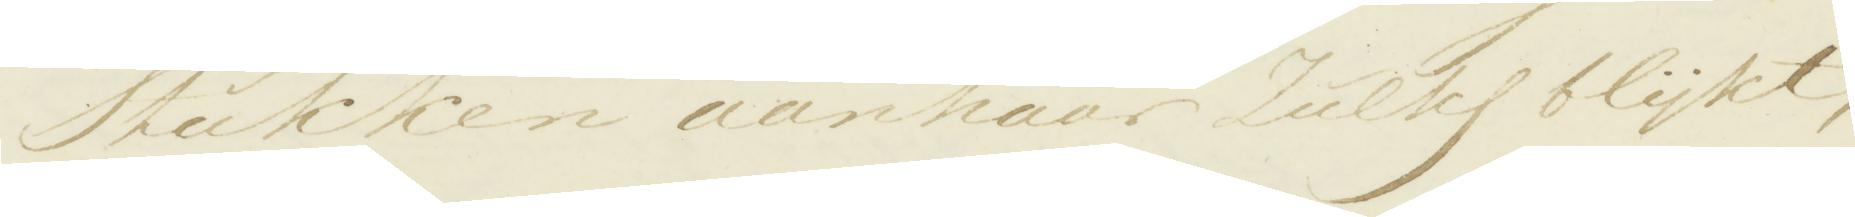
stukken aan haar zulks blijkt;
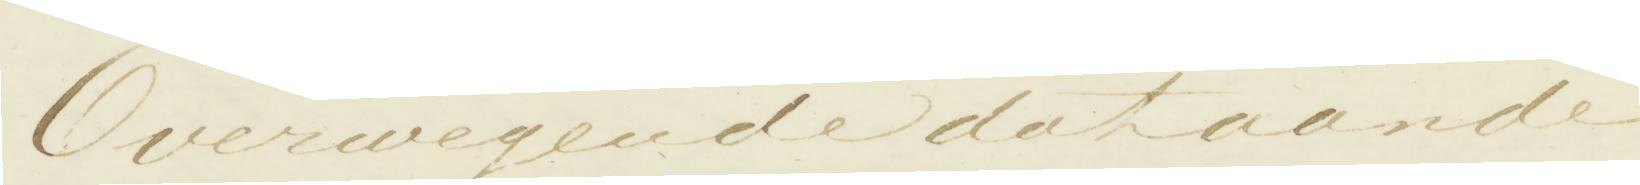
Overwegende dat aan de
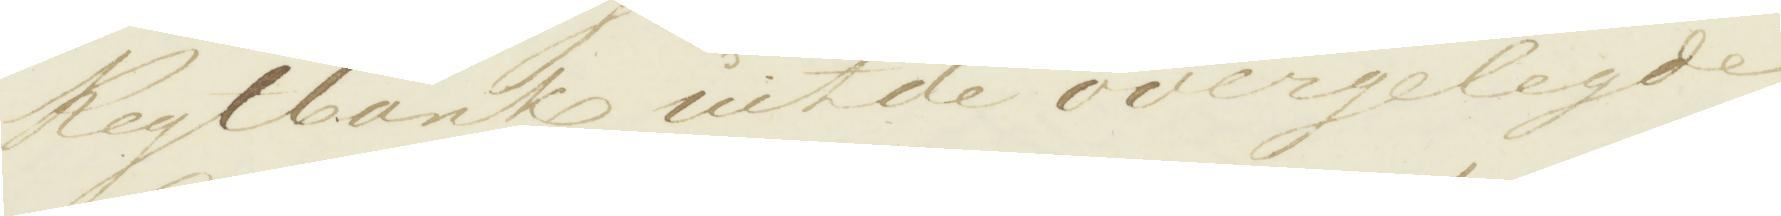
Regtbank uit de overgelegde
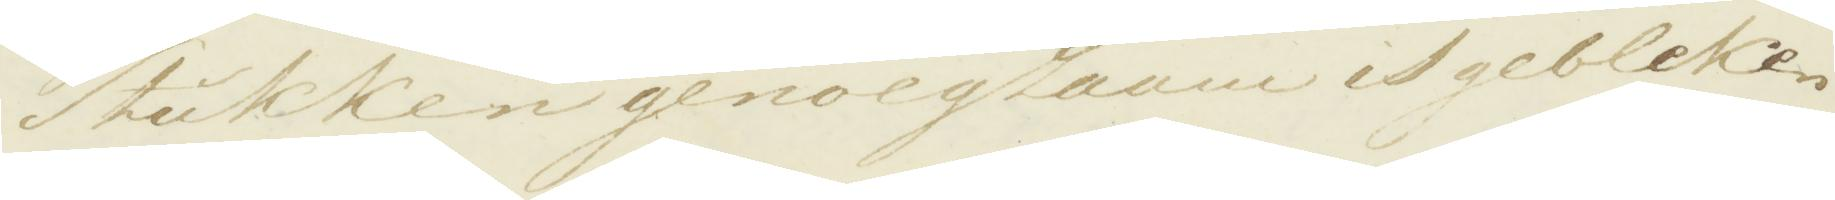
stukken genoegzaam is gebleken,
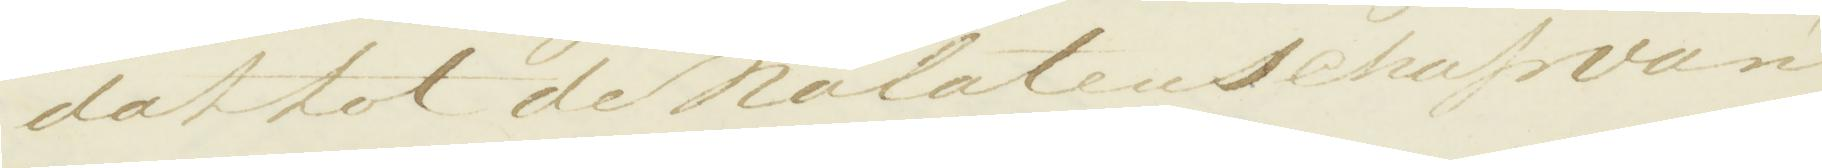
dat tot de Nalatenschap van
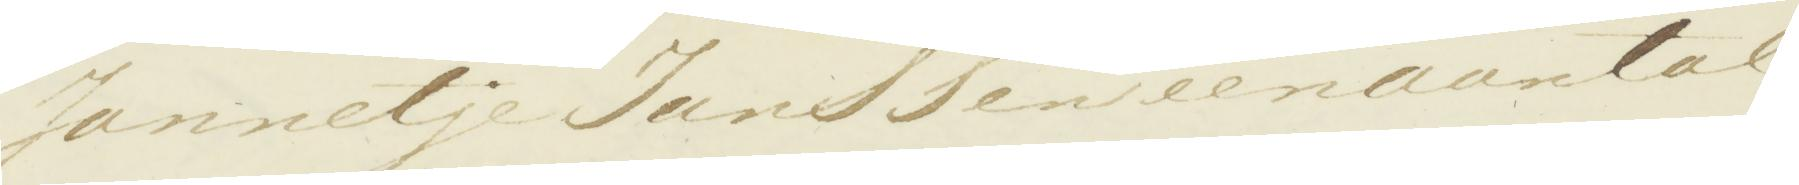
Jannetje Janssen een aantal
